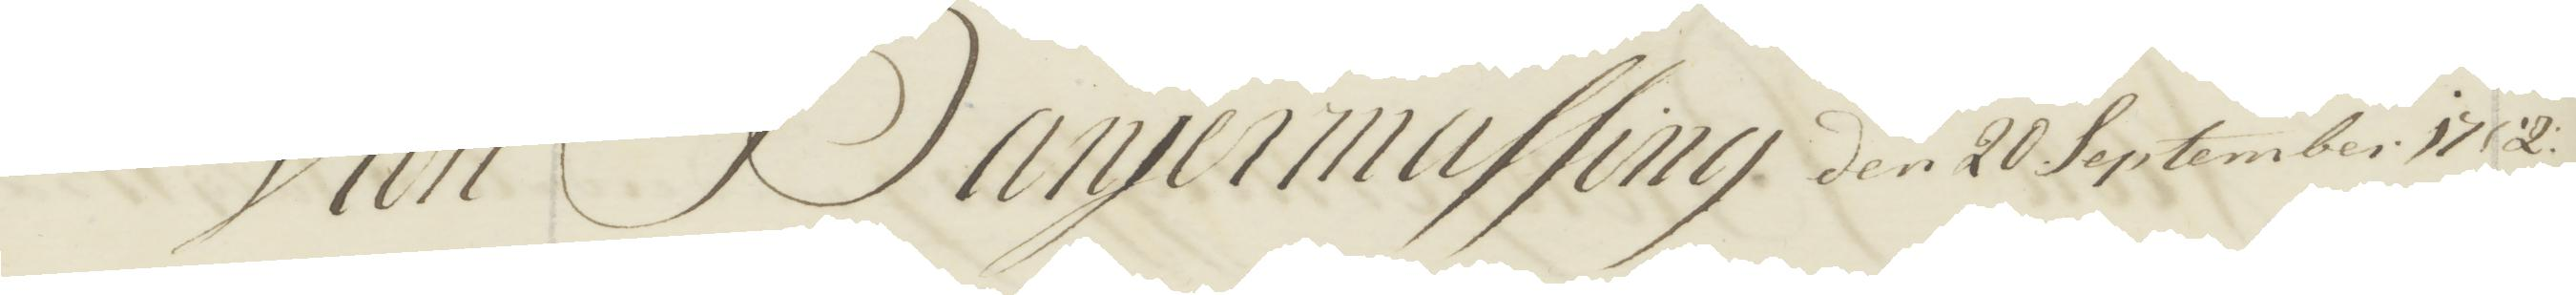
Van Banjermassing den 20. september 1712:
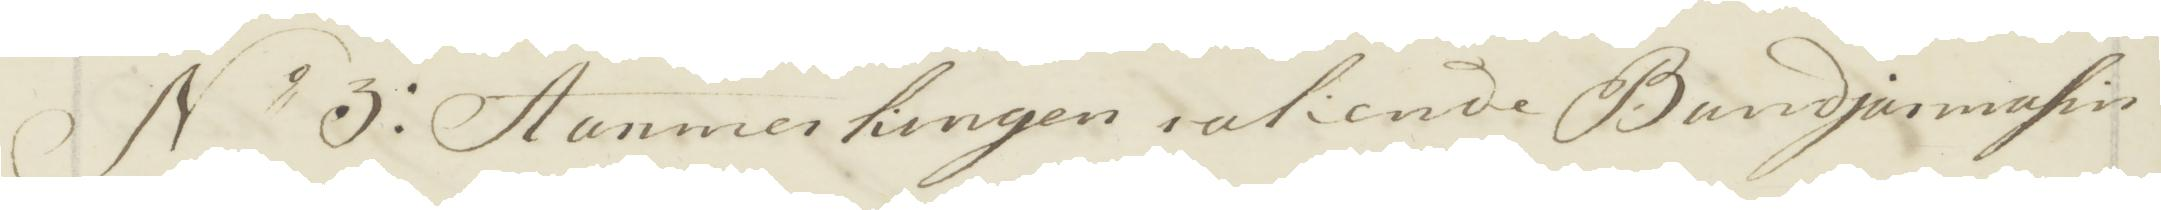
N„o 3: Aanmerkingen rakende Bandjarmasin
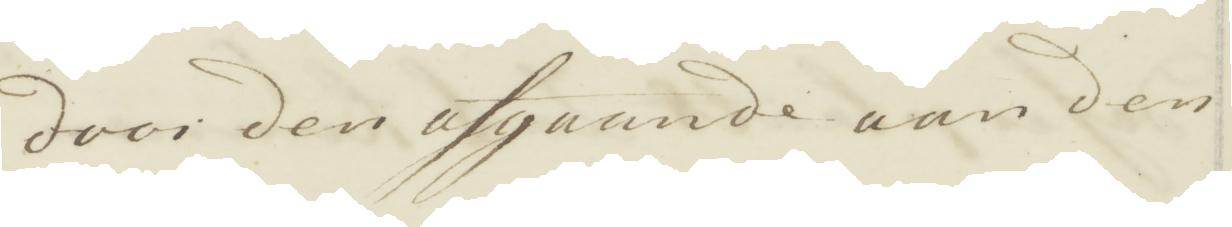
door den afgaande aan den
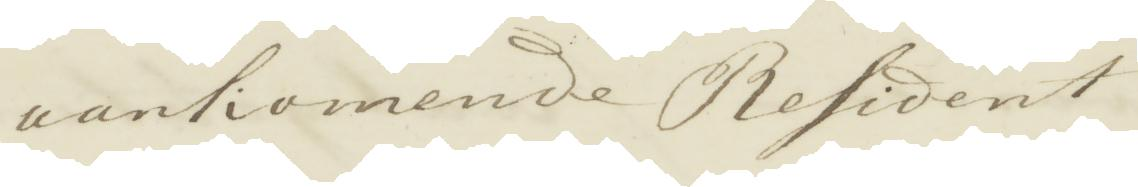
.aankomende Resident
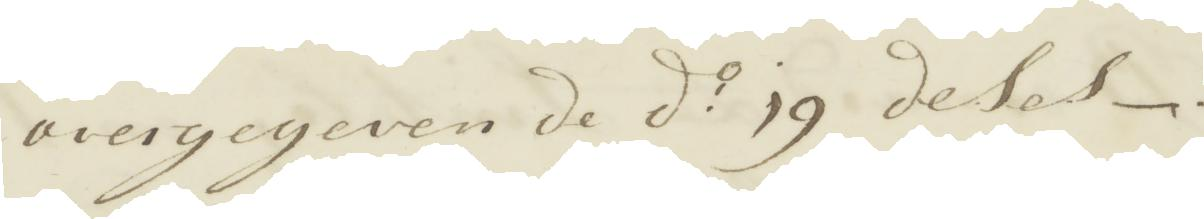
overgegeven de d:o 19 deses —
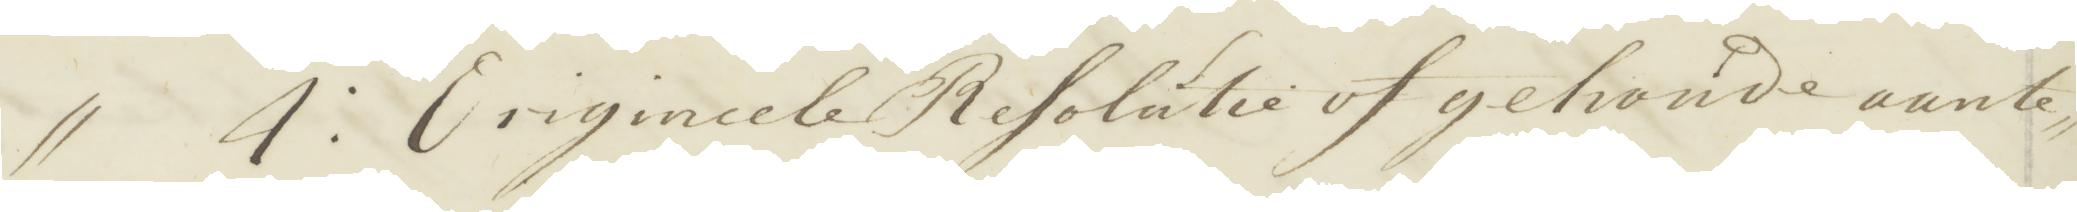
„ 4: Origineele Resolutie of gehoude aante„
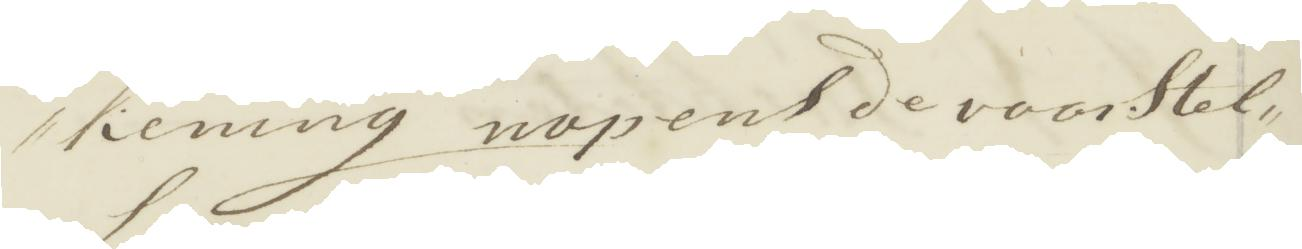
„kening nopens de voorstel„
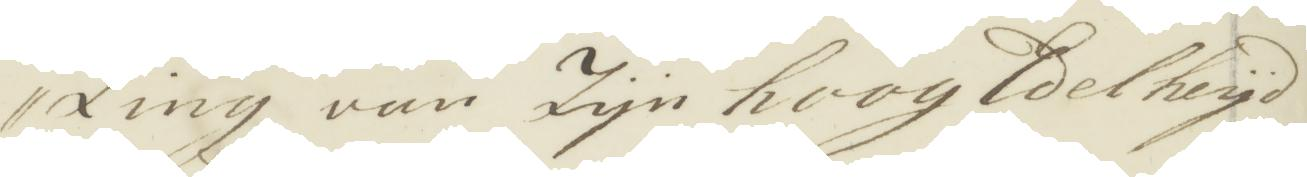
„ling van zijn hoog Edelheijd
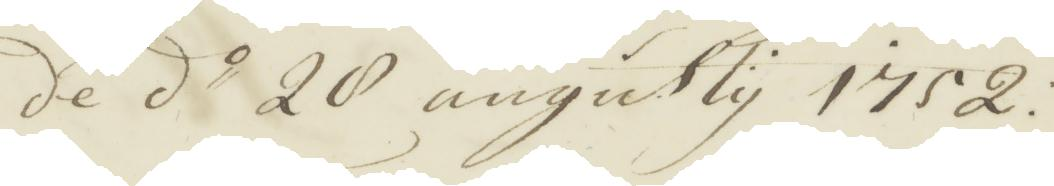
de d„o 28 augustij 1752:
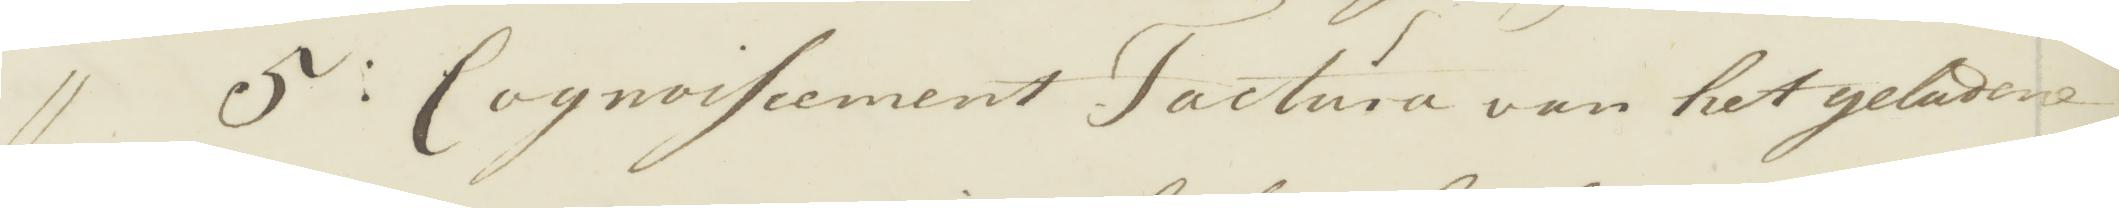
„ 5: Cognoiscement Factura van het geladene
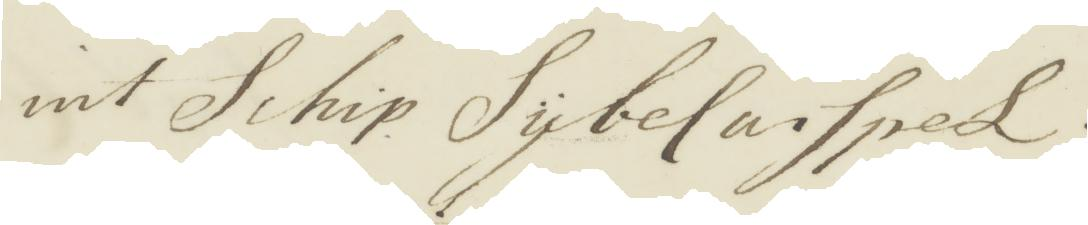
int schip sijbecaspel
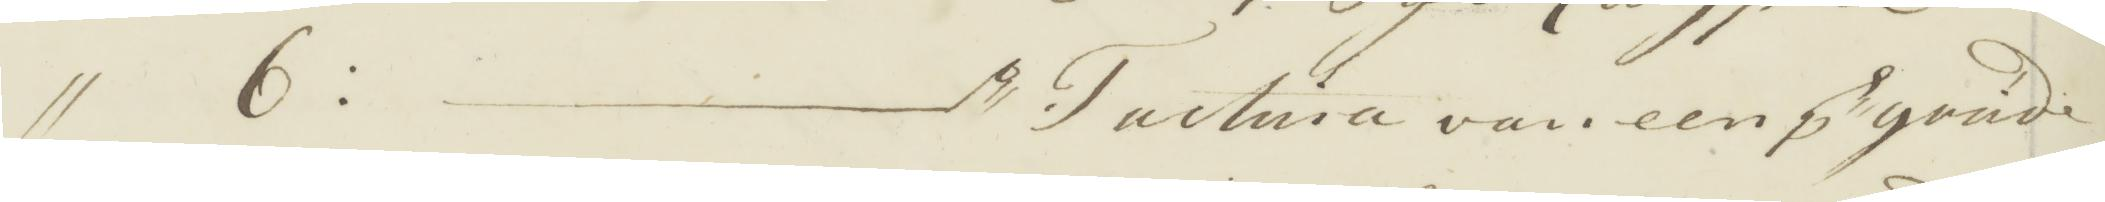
„ 6: _„o. Factura van een p„s goude
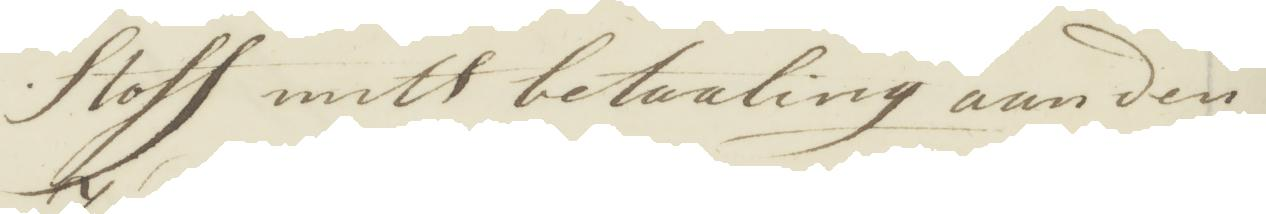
stoff mits betaaling aan den
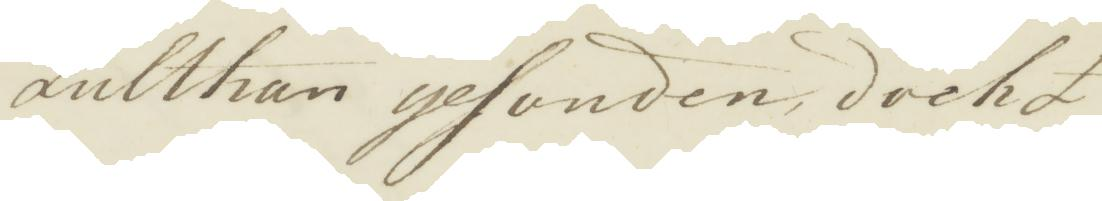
zulthan gesonden, doch t
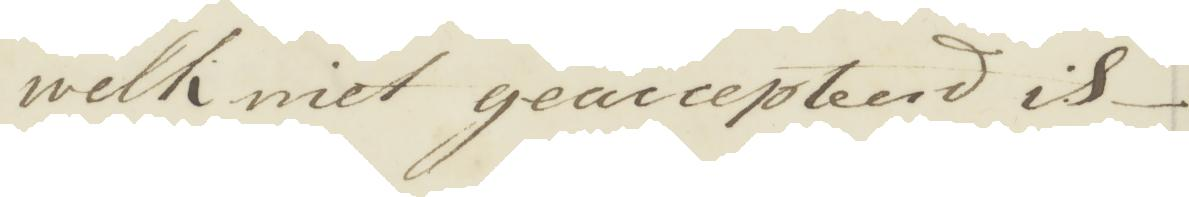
welk niet geaccepteerd is —
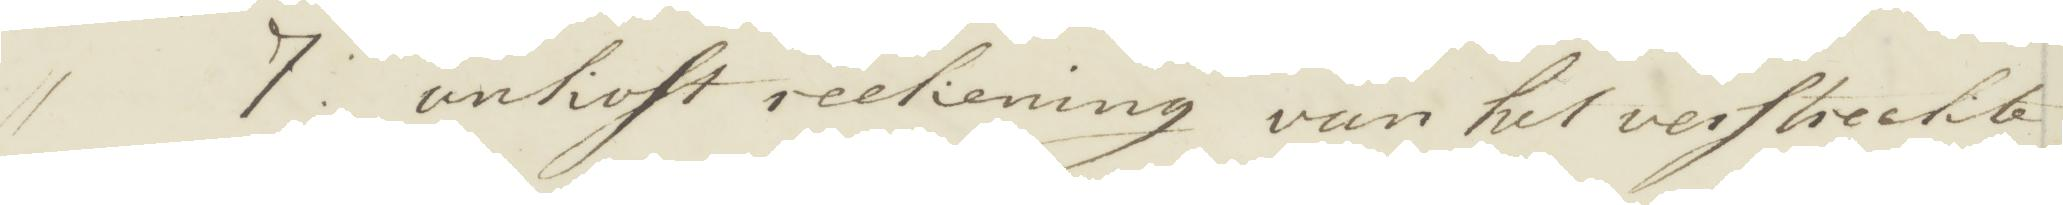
„ 7: onkost reekening van het verstreckte
